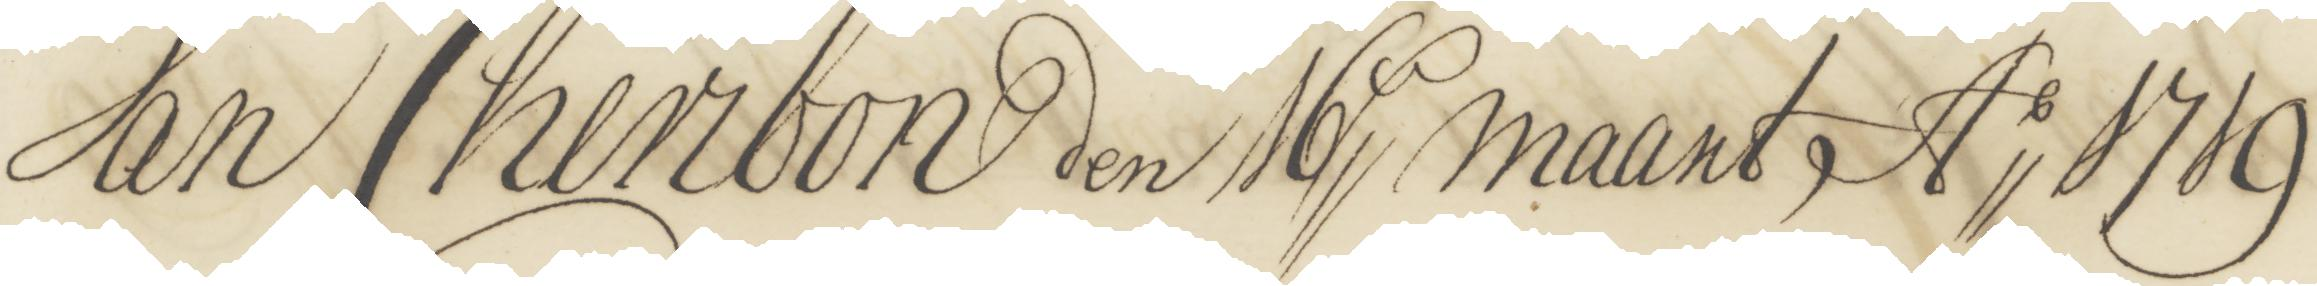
Van Cheribon den 16„e maant A„o 1719
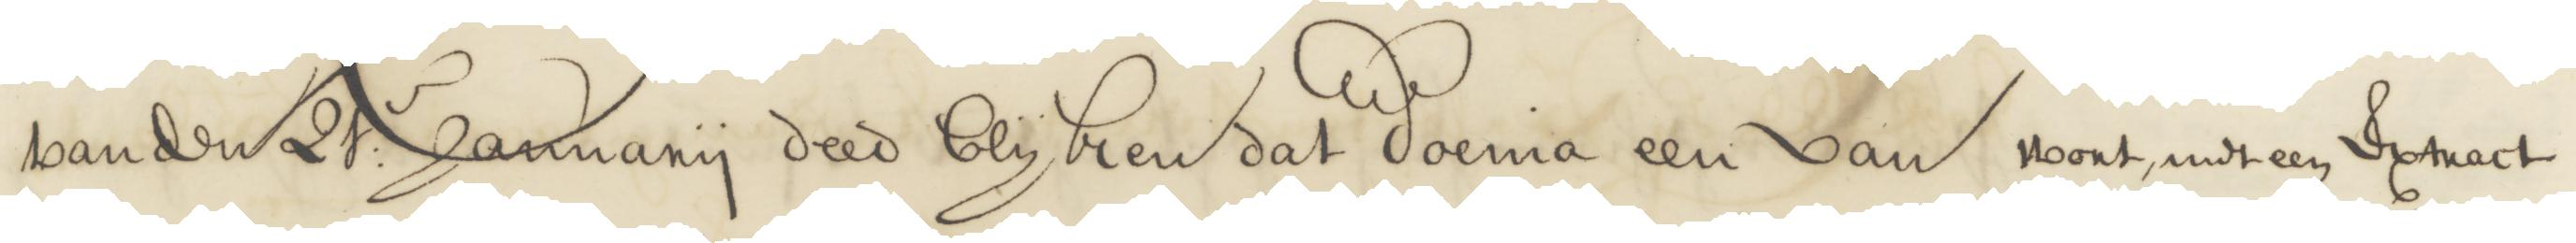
van den 21:' Januarij deed blijken dat doenia een van wort, met een Extract
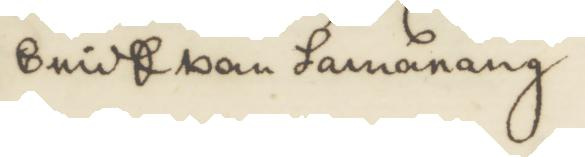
brief van Samarang
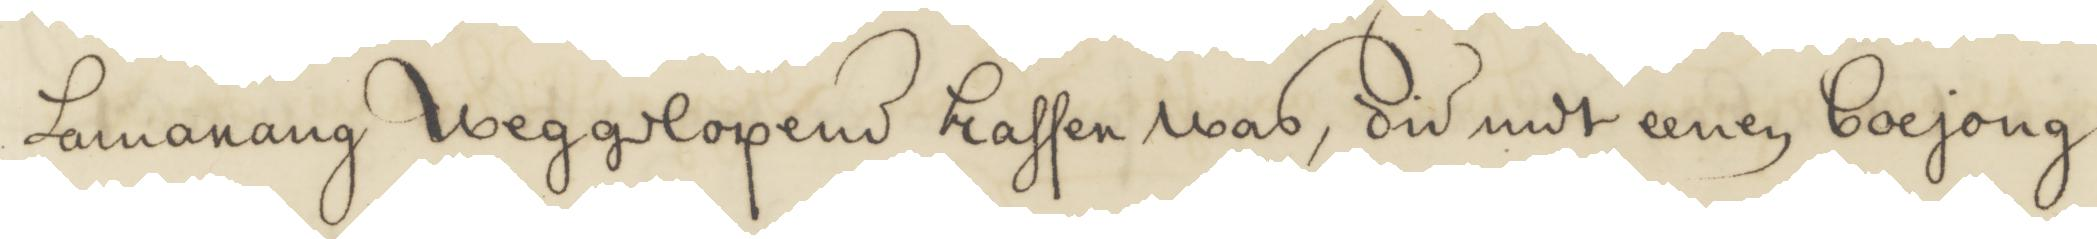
Samarang weggelopene kasser was, die met eenen boejong
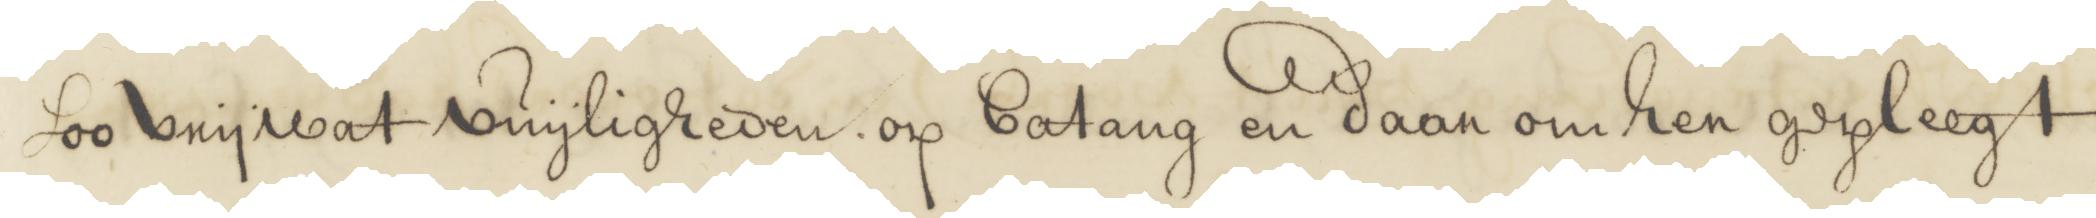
soo vrij wat vuijligheden op batang en daar om hen gepleegt
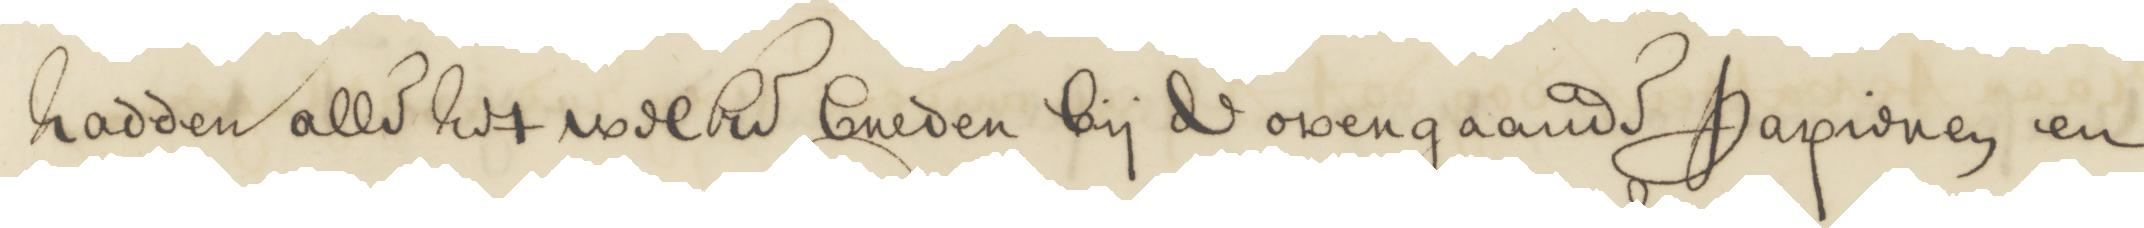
hadden alle het welke breden bij de overgaande papieren en
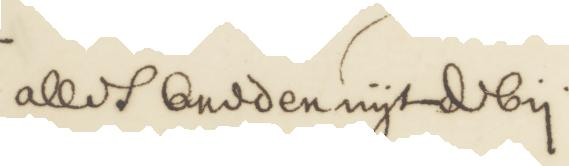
alles breder uijt de bij
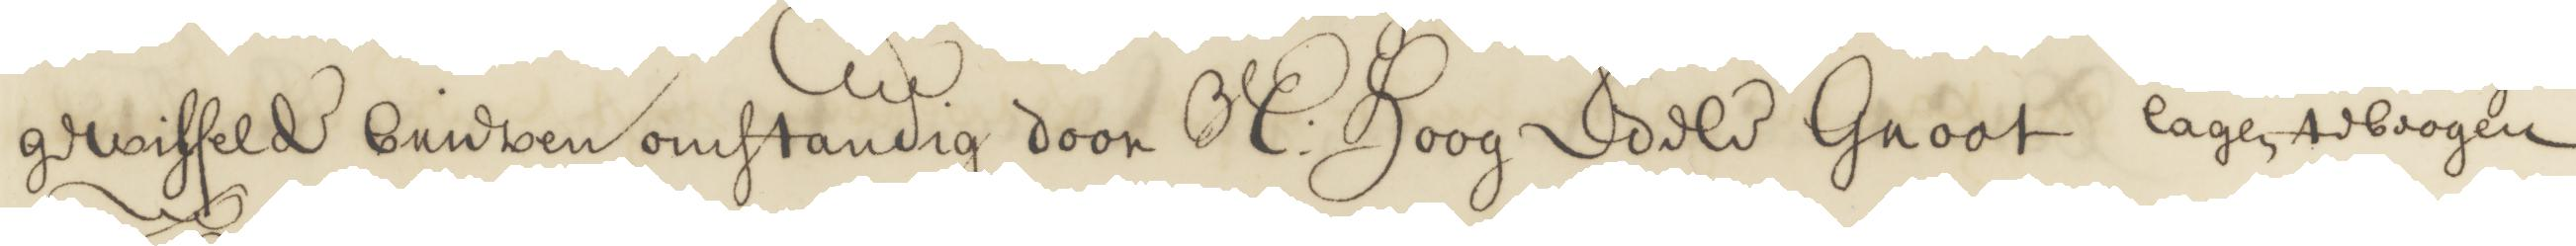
gewisselde brieven omstandig door UE: Hoog Edele Groot lagen te beogen
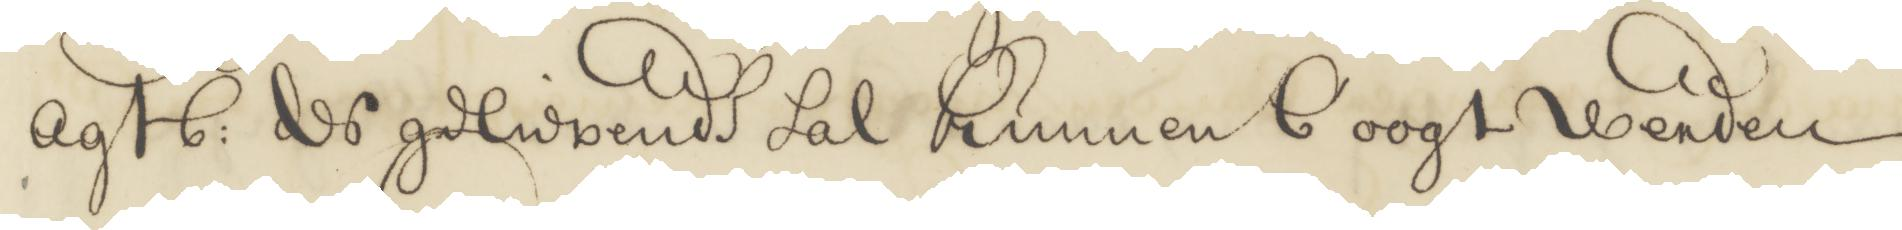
agtb: des gelievende sal kunnen b'oogt werden
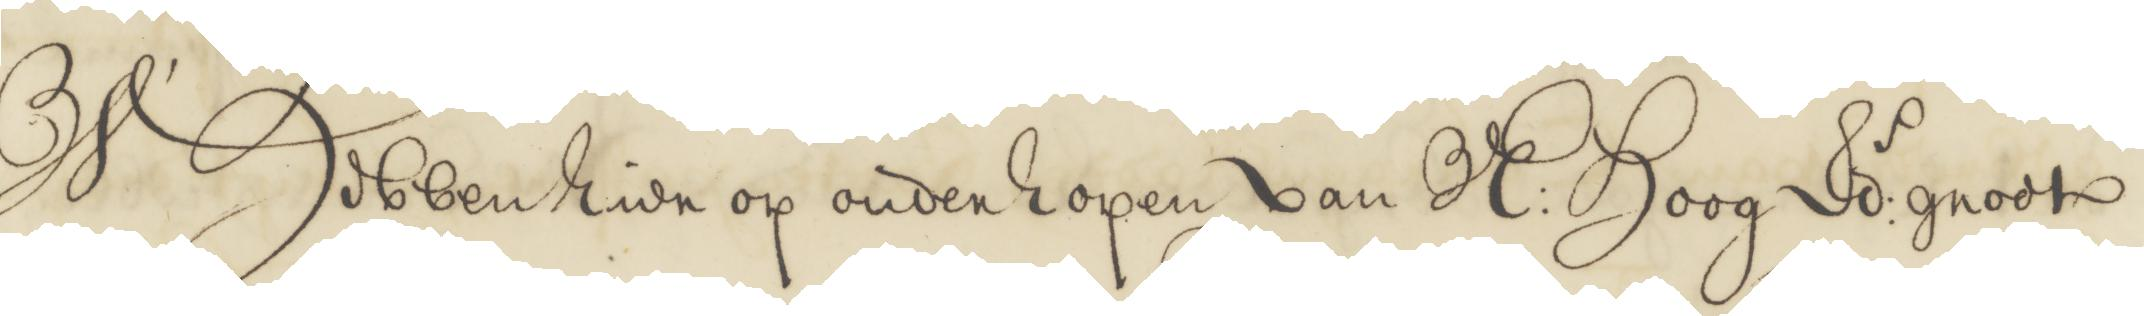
W' Hebben hier op onderhopen van UE: Hoog Ed: groot
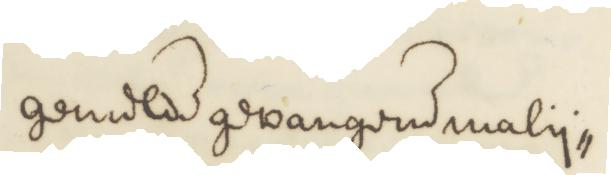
gemelde gevangene malij„
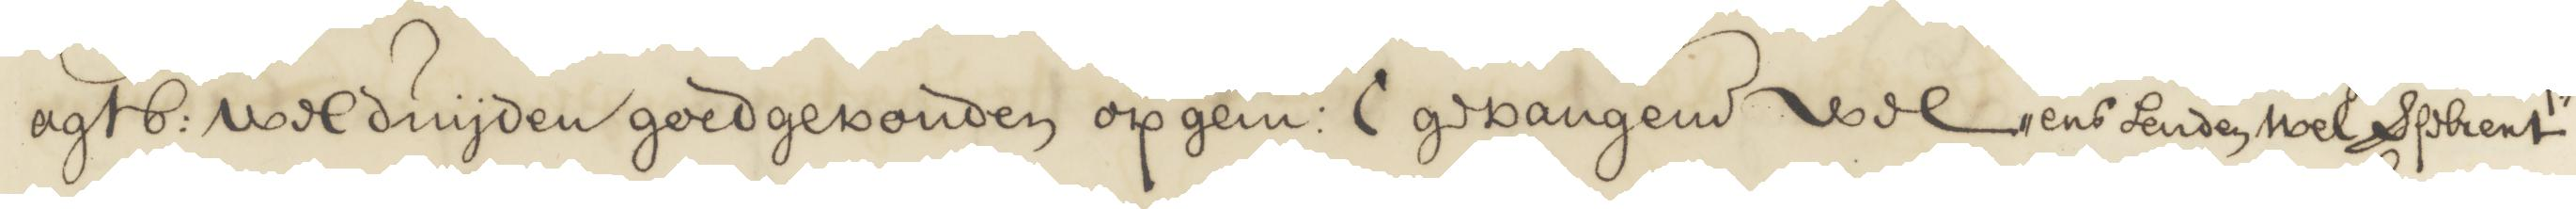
agtb: wel duijden goed gevonden op gem: 5 gevangene wel „ers senden wel versekert
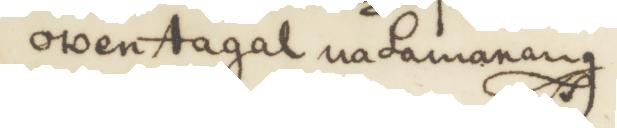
over tagal na Samarang
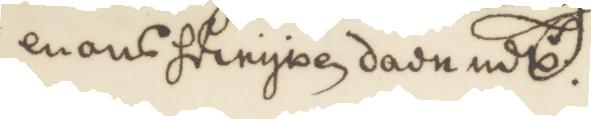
en ons schrijven daer rex:s.
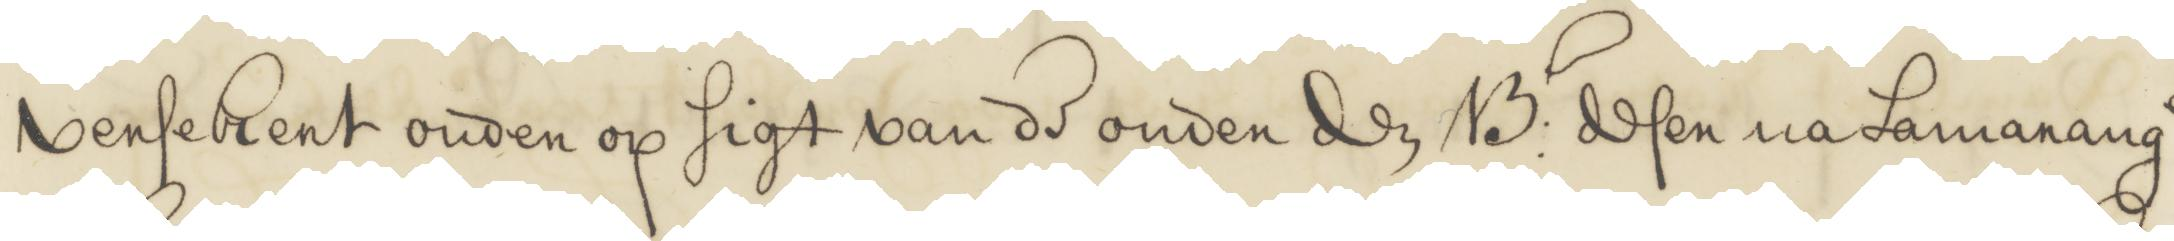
versekert onder op sigt van de onder den 13:' deser na Samarang
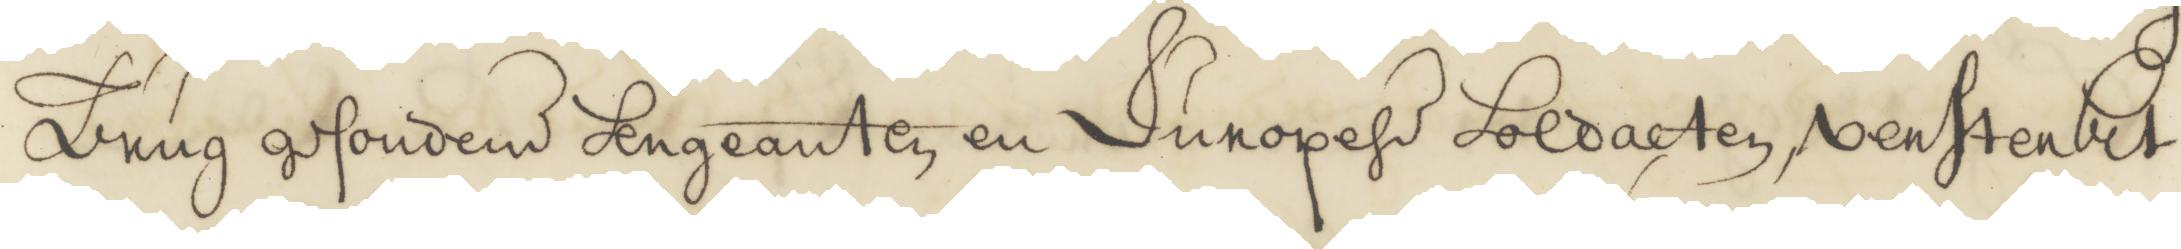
terug gesondene sergeanten en Europese soldaeten, versterkt
